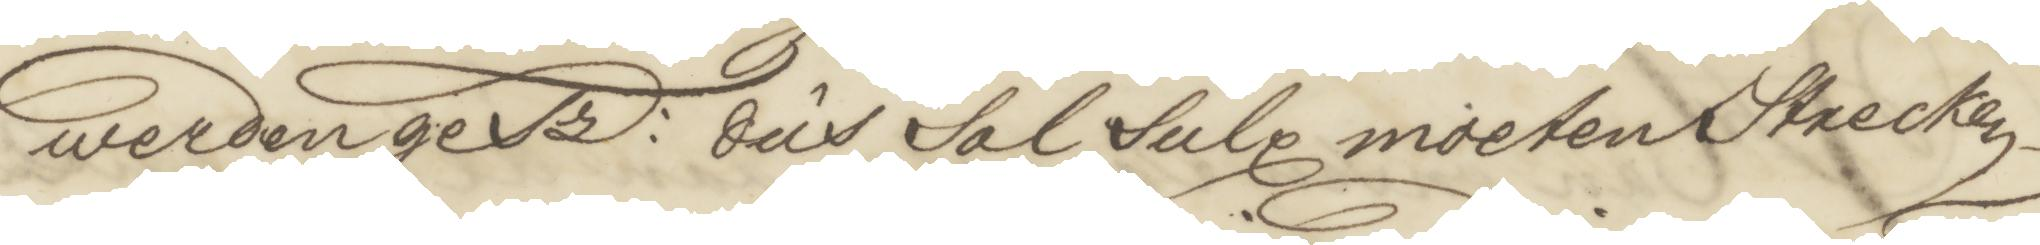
werden gesz: dus sal sulx moeten strecken
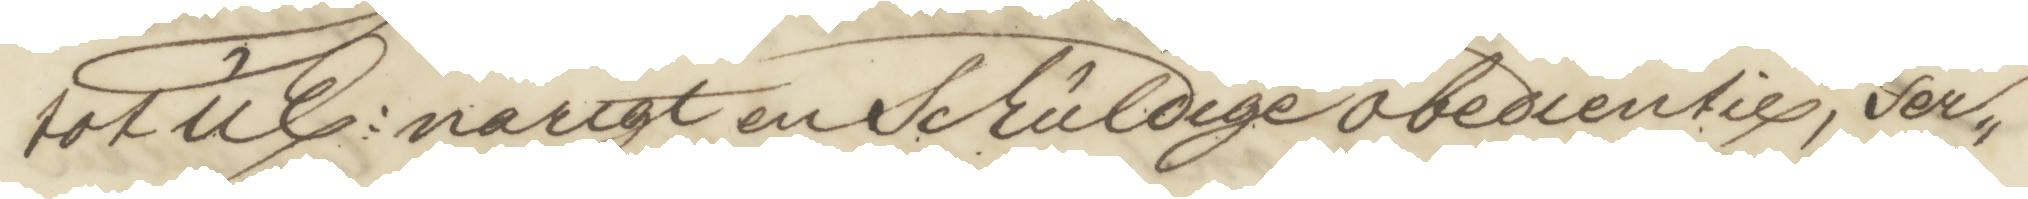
tot UE: narigt en schuldige obedientie, Ter„
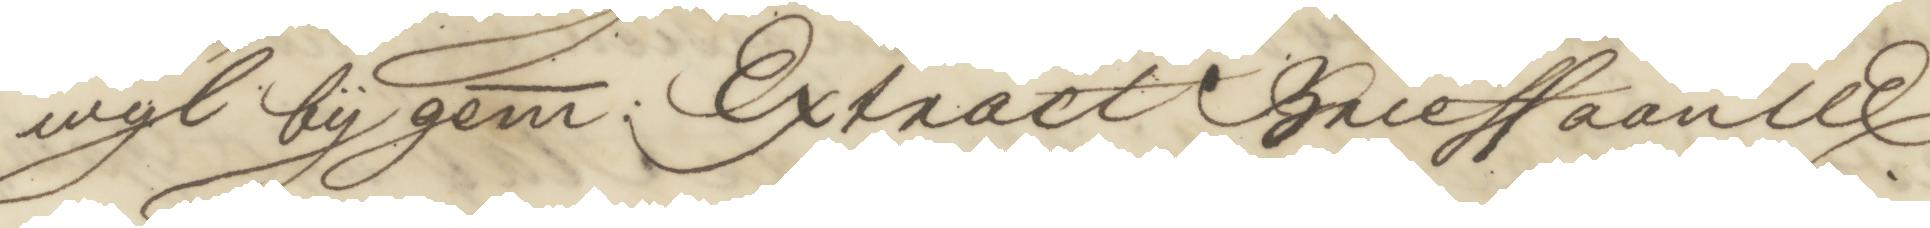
wijl bij gem: Extract Brieff aan UE
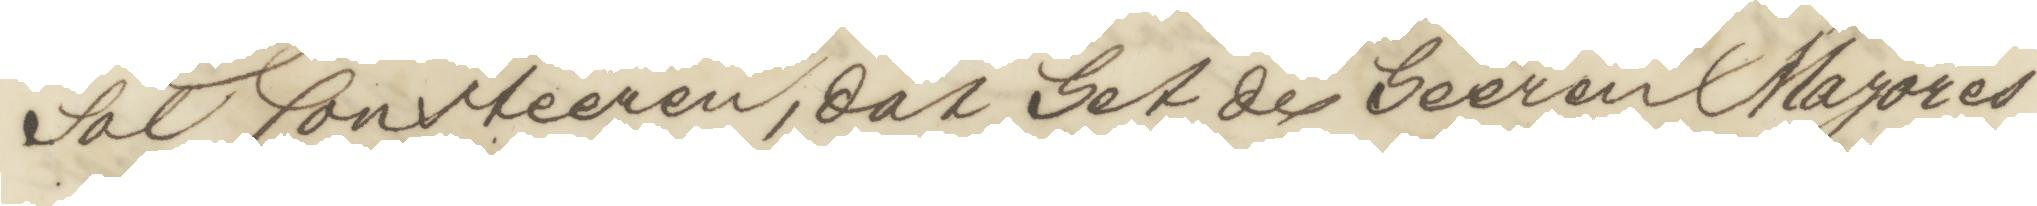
sal Consteeren, dat het de heeren Majores
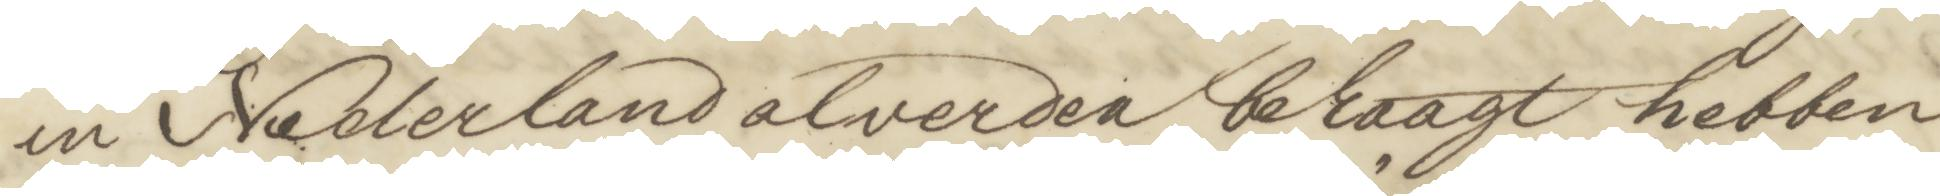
in Nederland al verder behaagt hebben
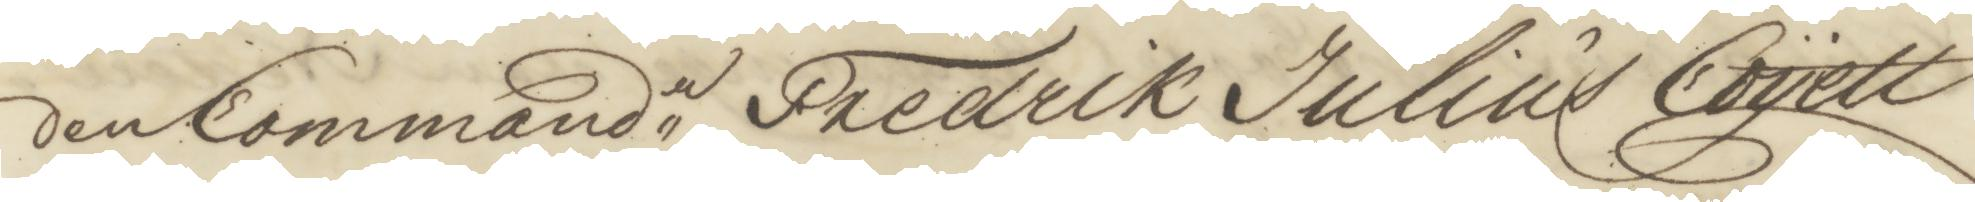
den Command„r Fredrik Iulius Coijett
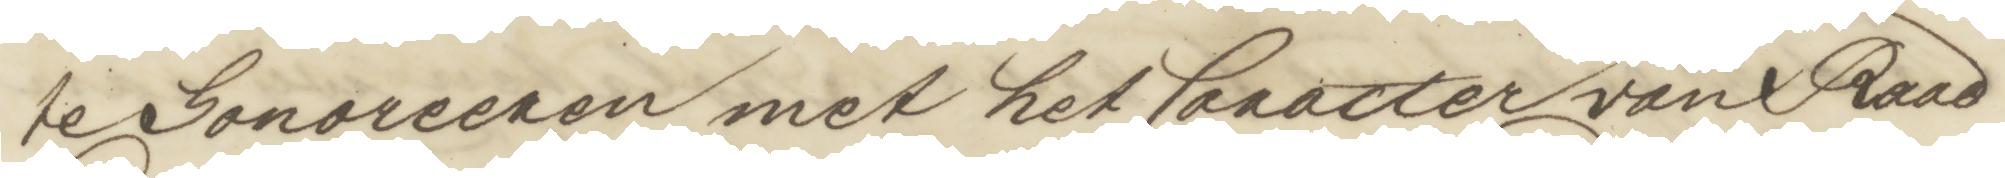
te honoreeren met het Caracter van Raad
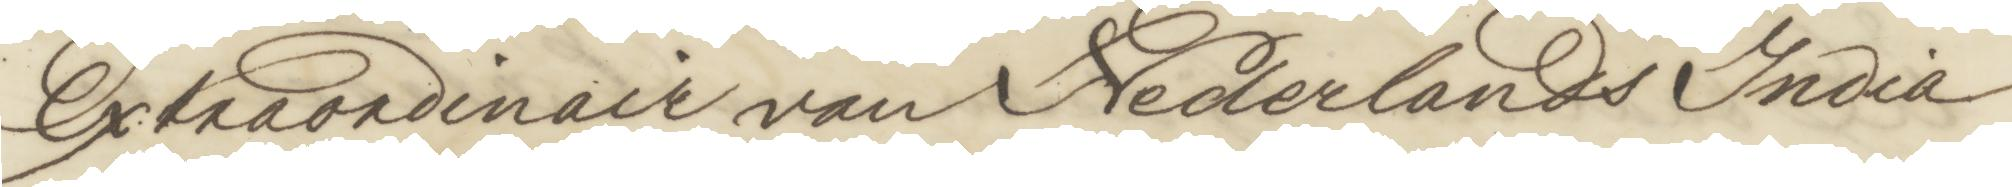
Extraordinair van Nederlands India
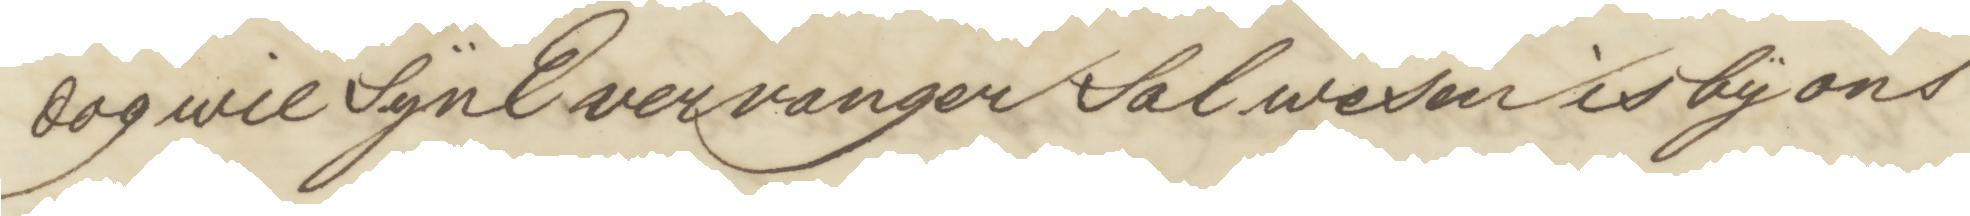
dog wie sijn E vervanger sal wesen is bij ons
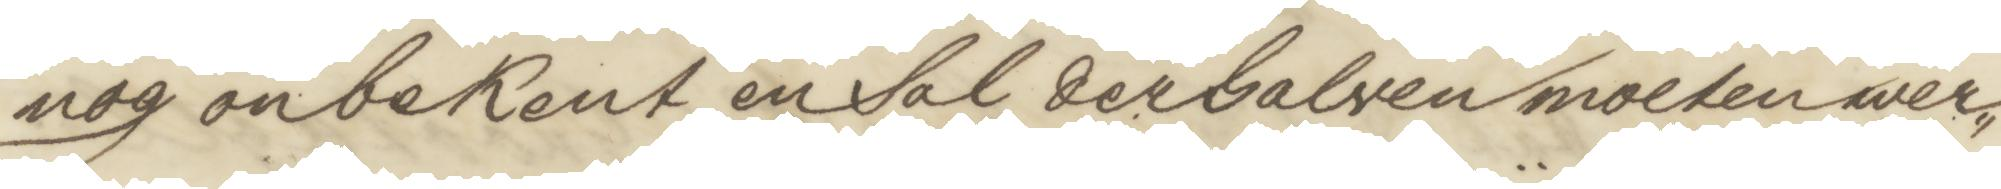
nog onbekent en sal derhalven moeten wer„
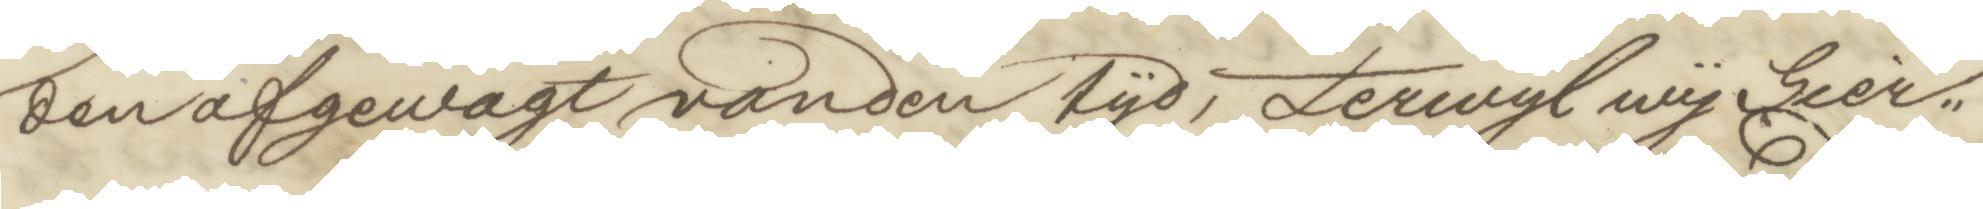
den afgewagt vanden tijd, terwijl wij hier„
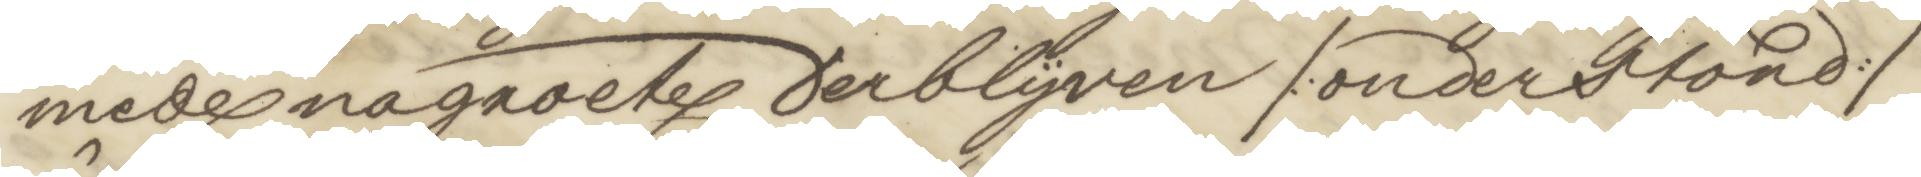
mede na groete Verblijven /:onderstond:/
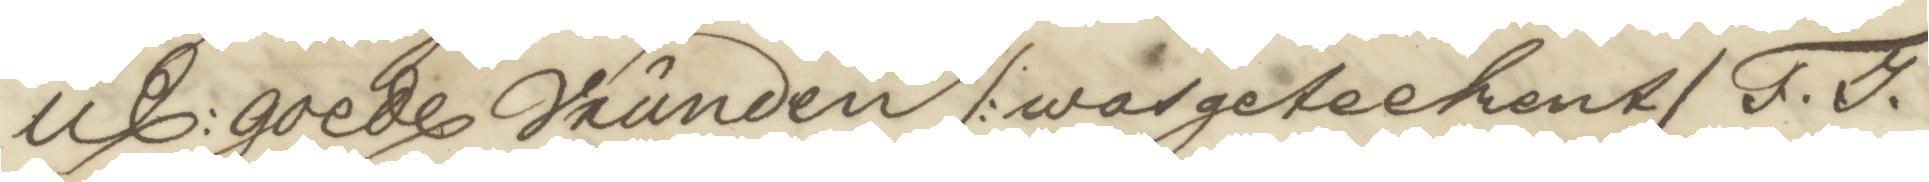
UE: goede vrunden /:was geteekent/ F. I.
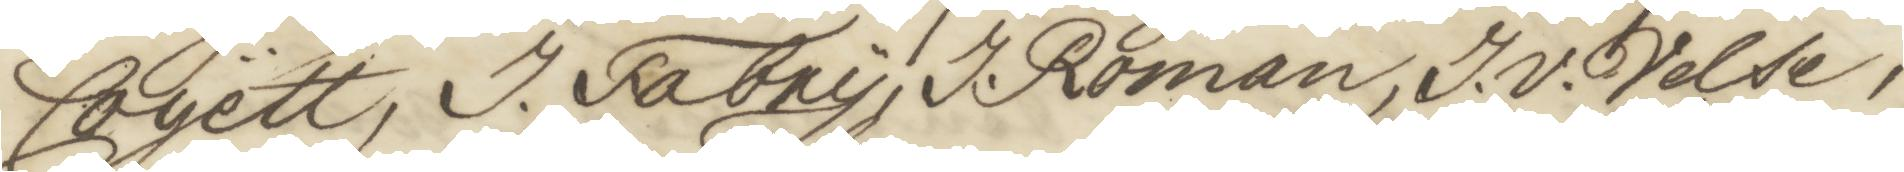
Coijett, I. Fabrij, I. Roman, I. v. Velse,
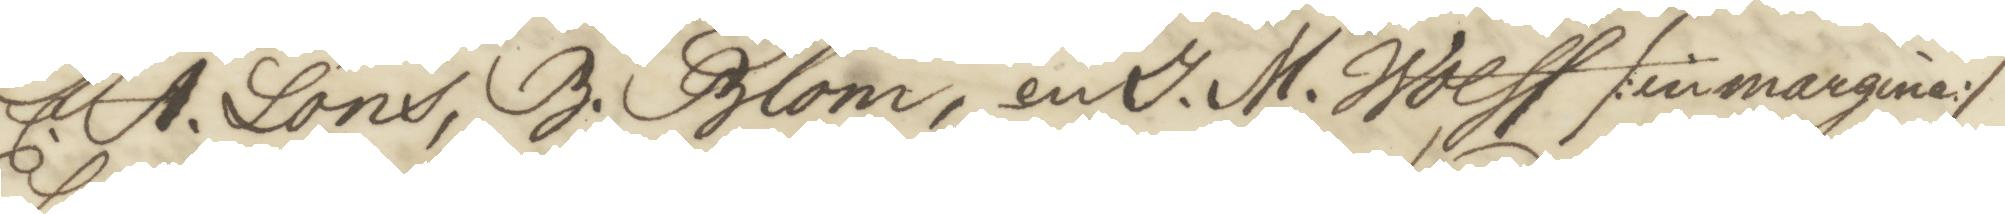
C. A. Lons, B. Blom, en I. M. Wolff /:in margine:/
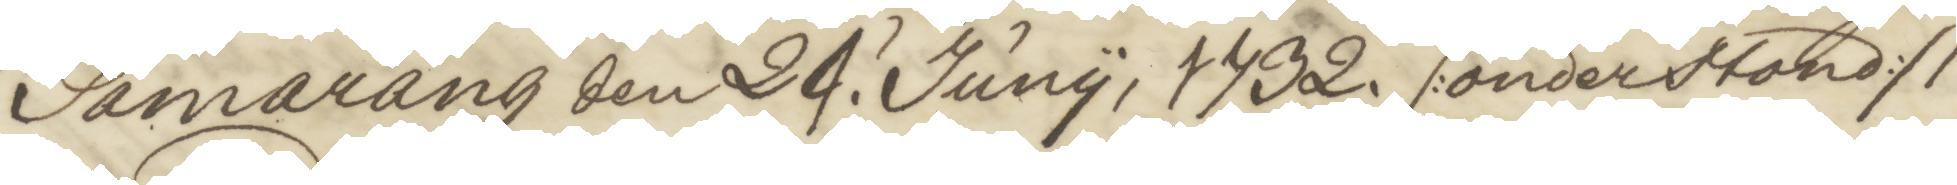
Samarang den 24.' Iunij, 1732. /:onderstond:/
